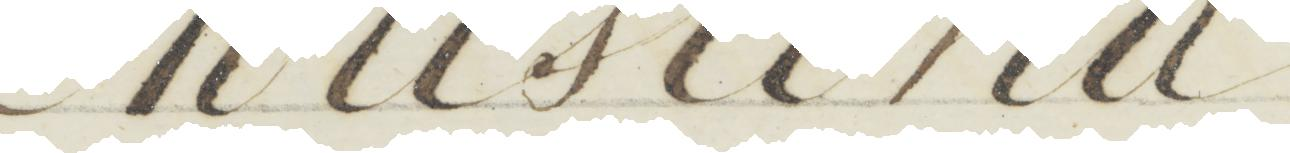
Christina
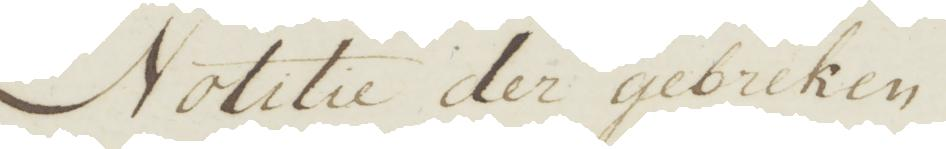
Notitie der gebreken
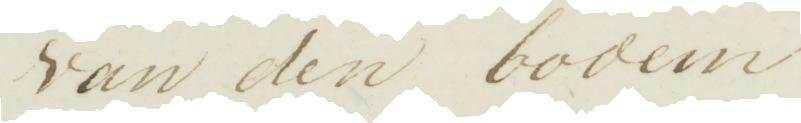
van den bodem
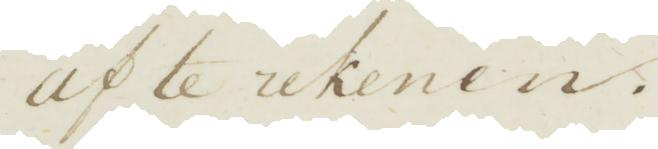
af te rekenen.
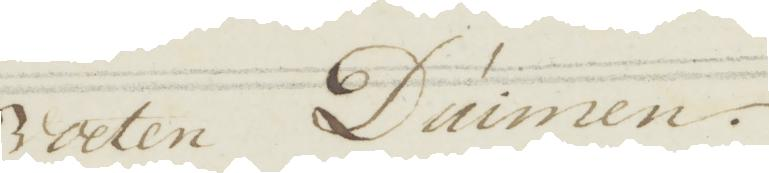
voeten Duimen.
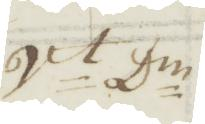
v=t D=m
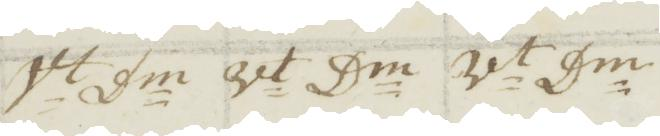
v=t D=m v=t D=m v=t D=m
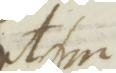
=t D=m
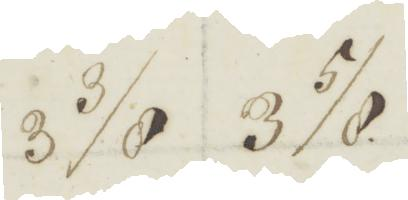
3 3/8 3 5/8
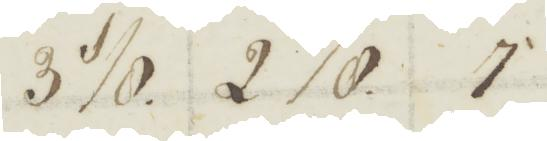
3 1/8. 2 5/8. 7'
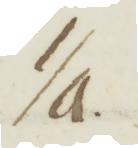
¼.
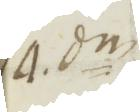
3/4. d=m
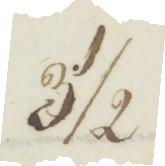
3½
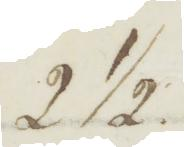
2 ½.
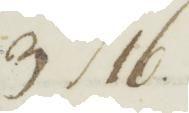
3 1/16.
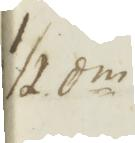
½ d=m
